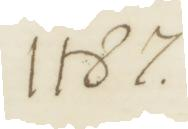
1187.
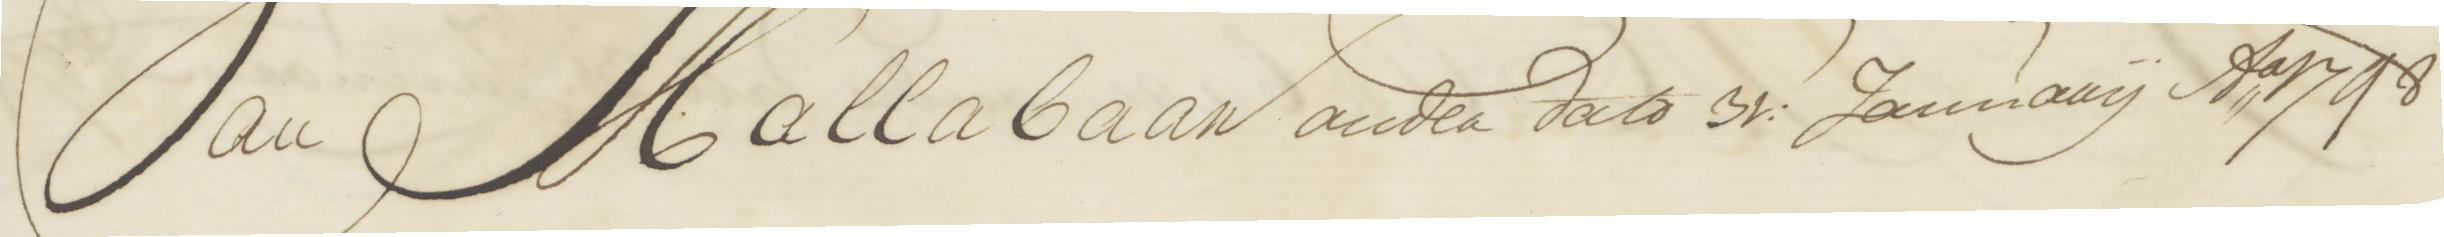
Van Mallabaar onder dato 31:en Januarij A„o1748
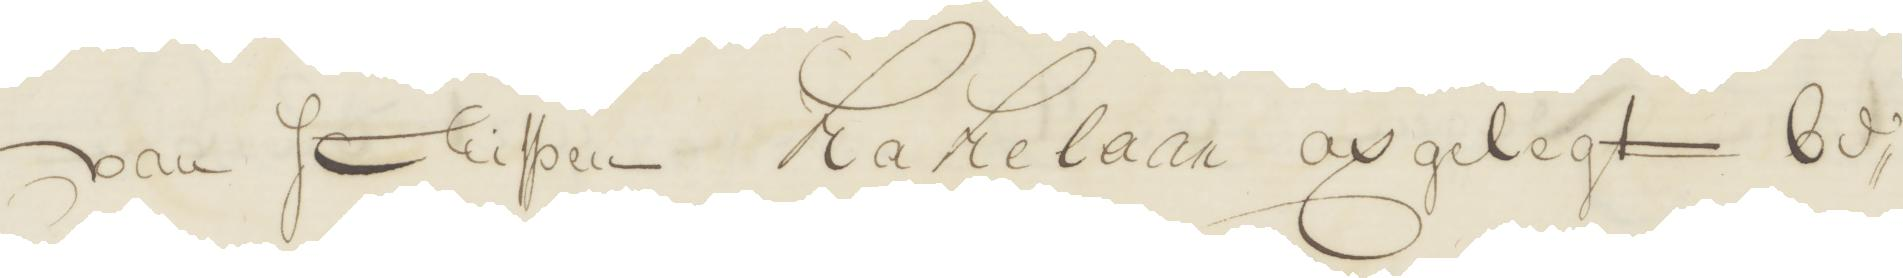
van schipper kakelaar overgelegt be„
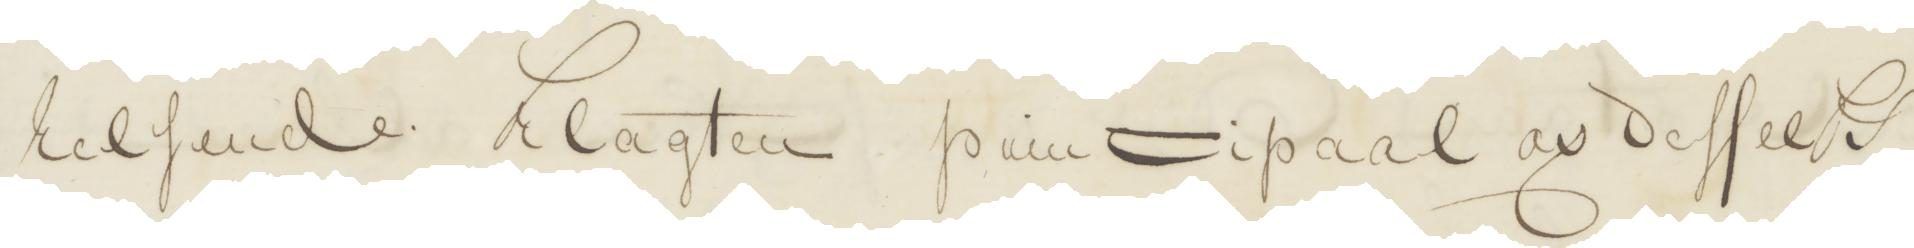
helsende klagten principaal over desselfs
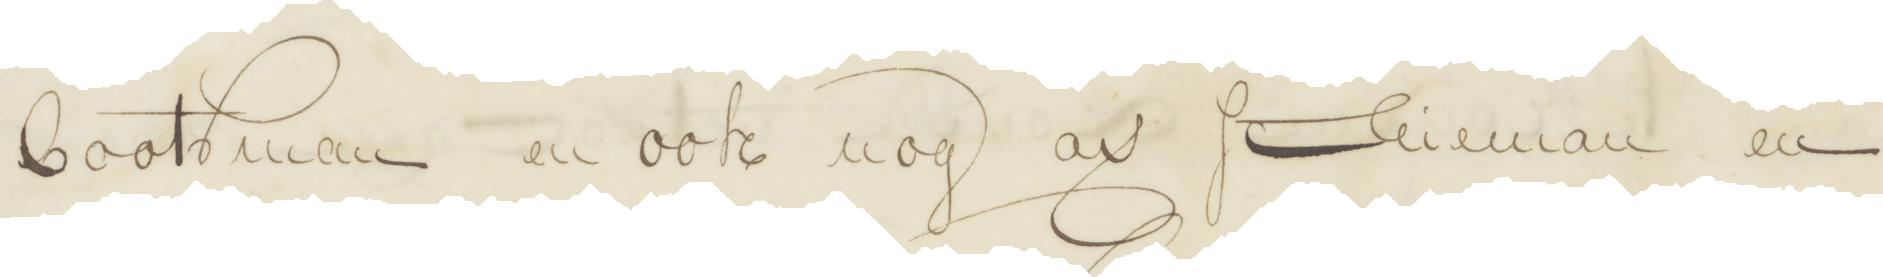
bootsman en ook nog over schieman en
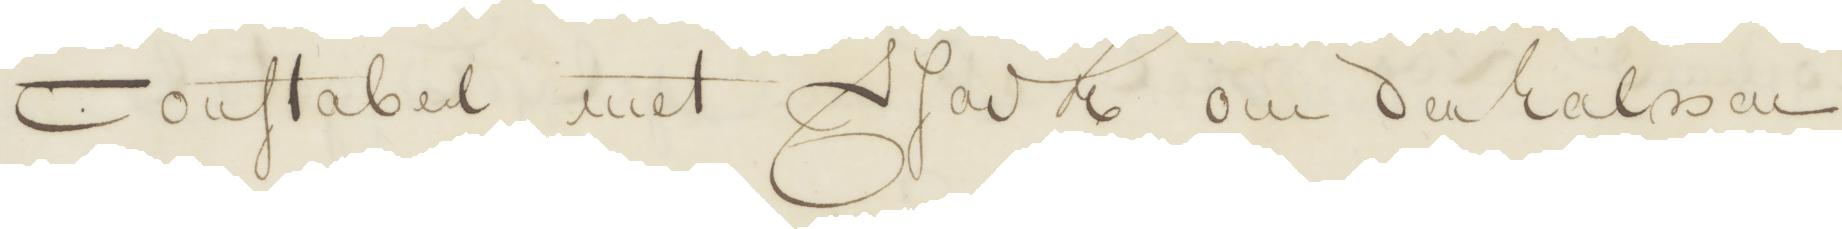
constabel met versoek om derhalven
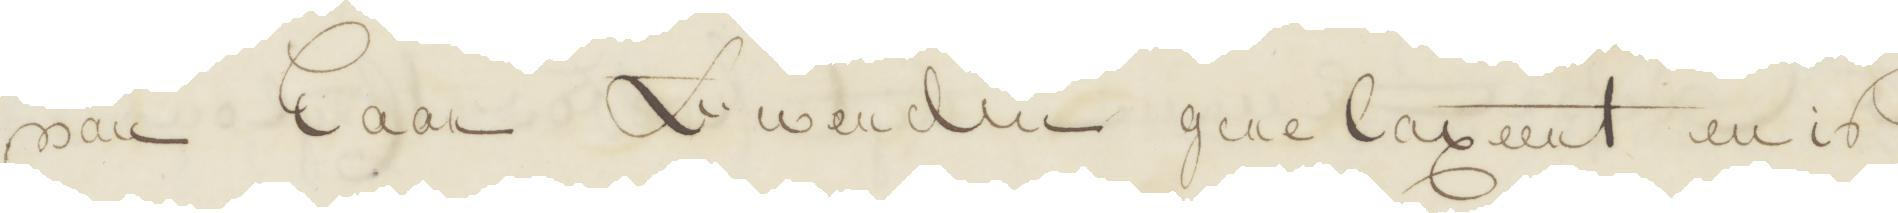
van haar te werden gerelaxeert en is
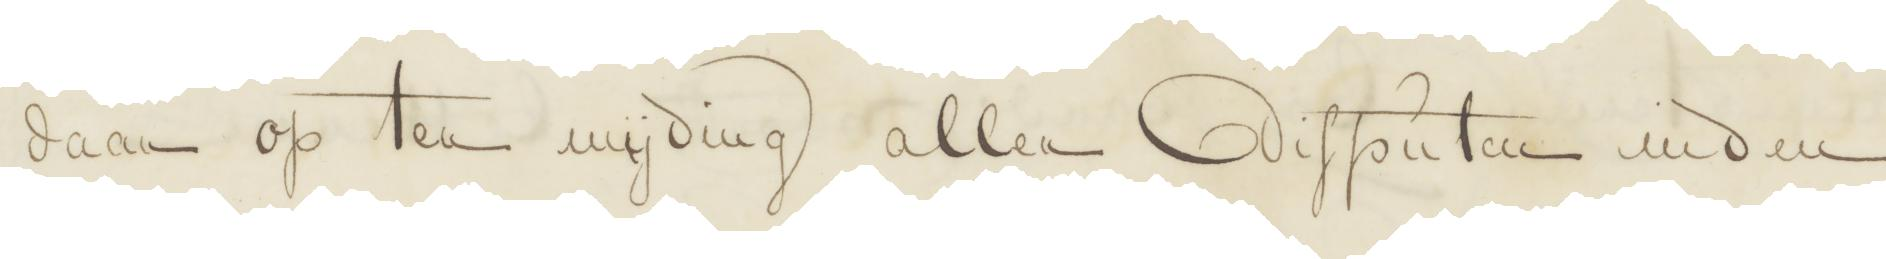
daar op ter mijding aller disputen in den
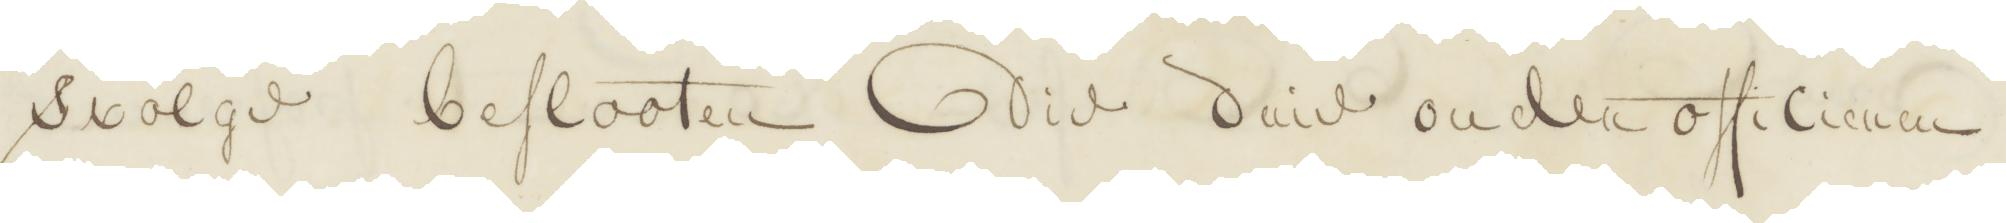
vervolge beslooten die drie onder officieren
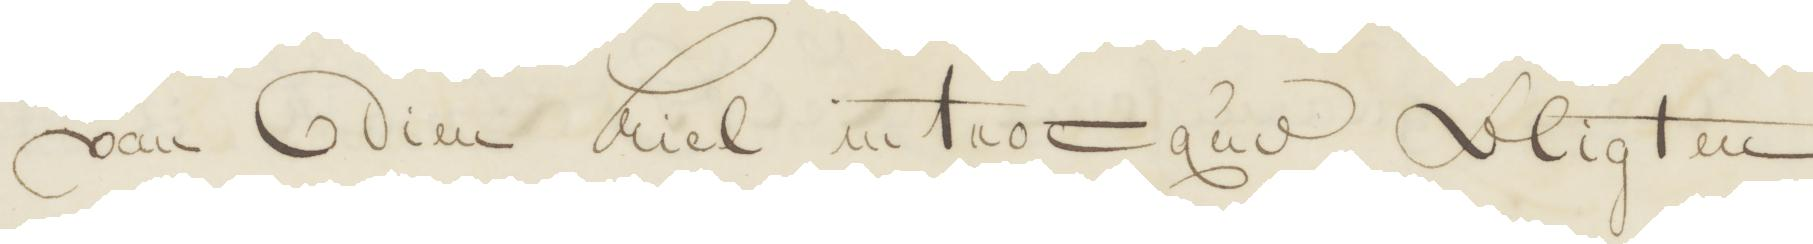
van dien kiel in trocque teligten
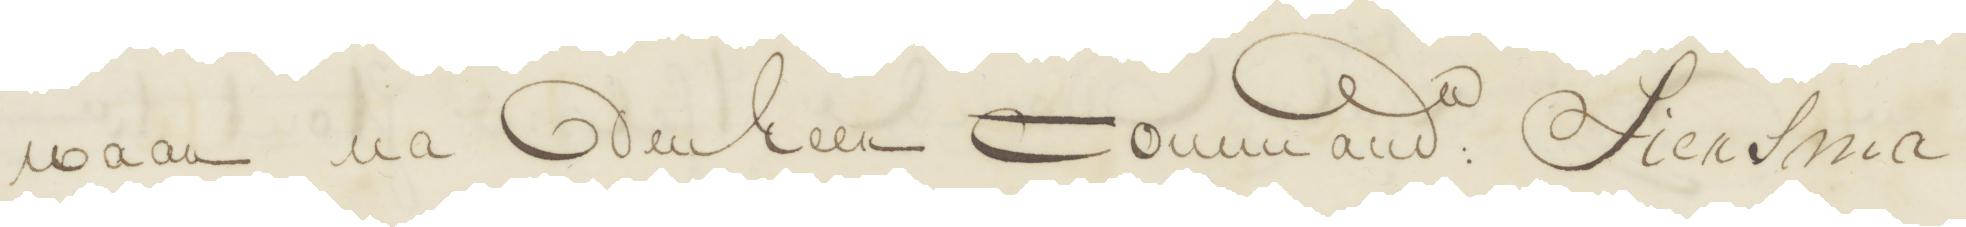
waar na den heer Command:r Siersma
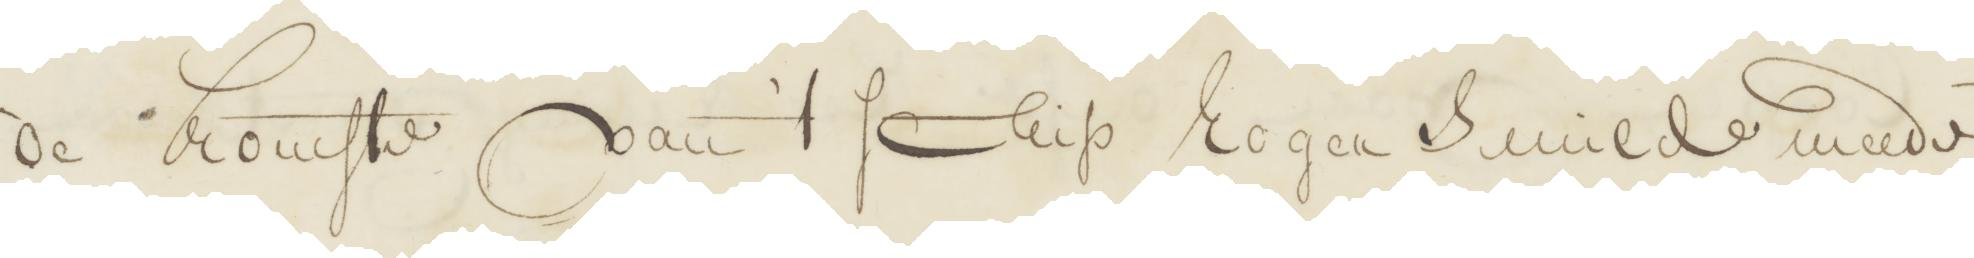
de komste van ’t schip hoger smilde meede
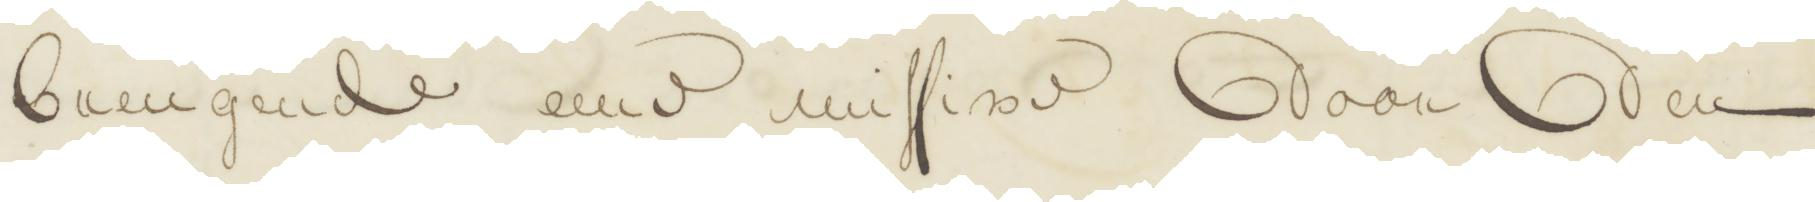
brengende eene missive door den
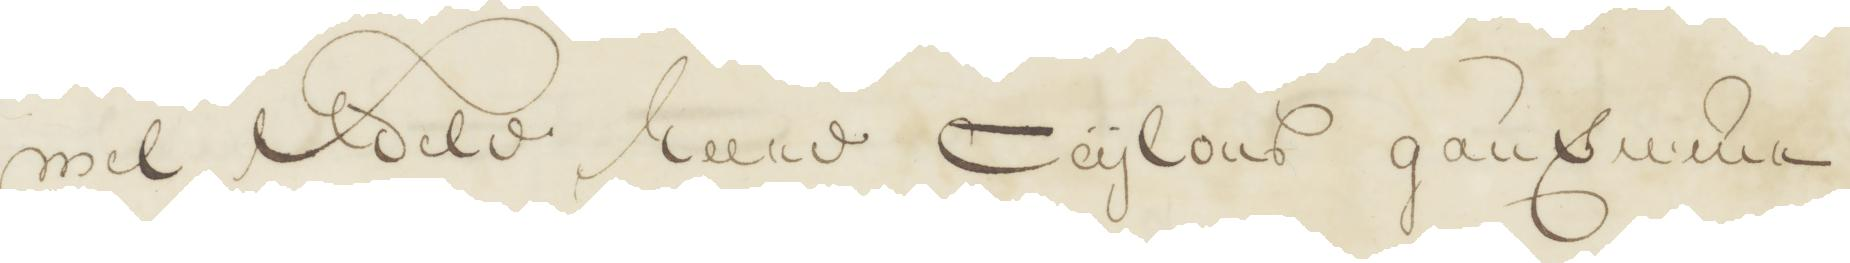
wel Edele heere ceijlons gouverneur
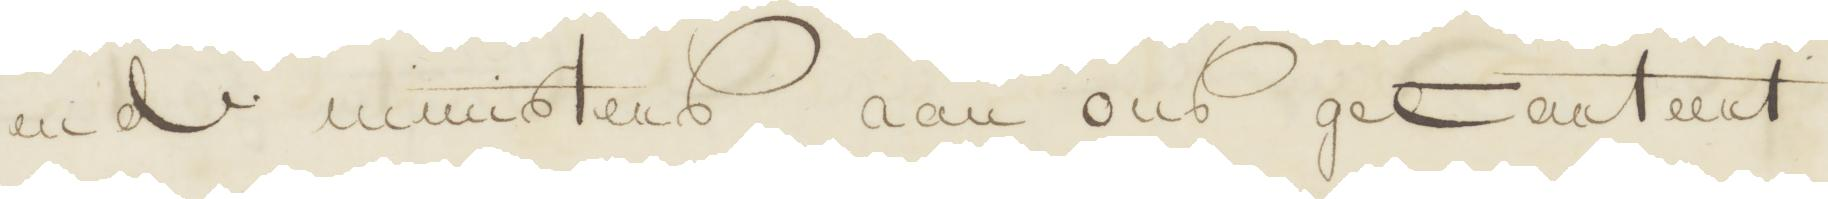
en de ministers aan ons gecarteert
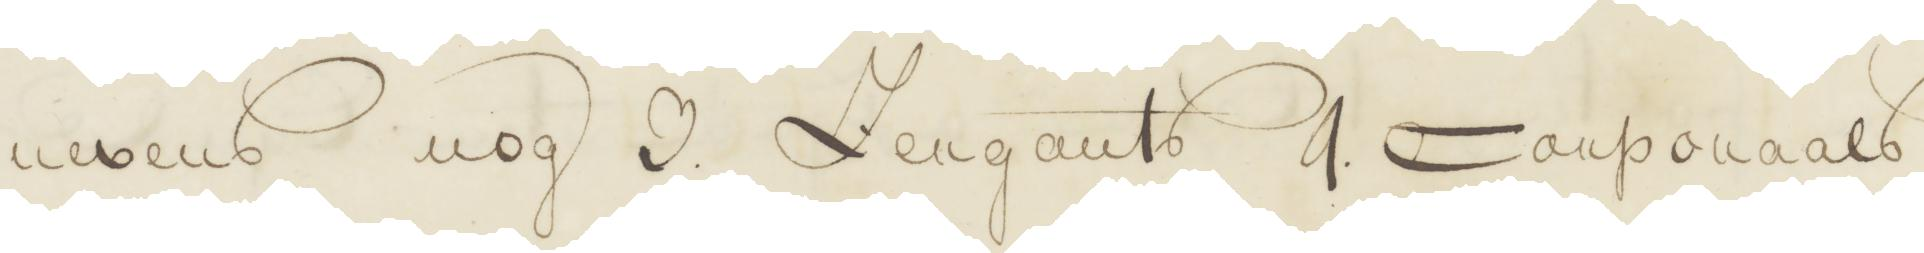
nevens nog 3. zergants 4. corporaals
